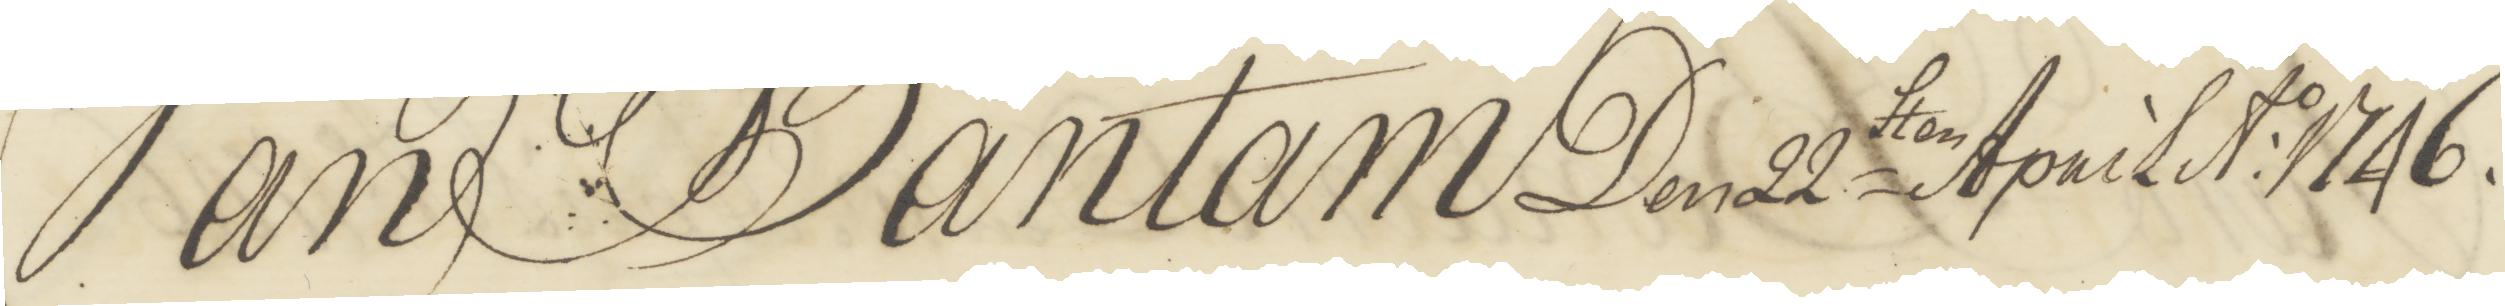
Van Bantam Den 22=sten April A:o 1746.
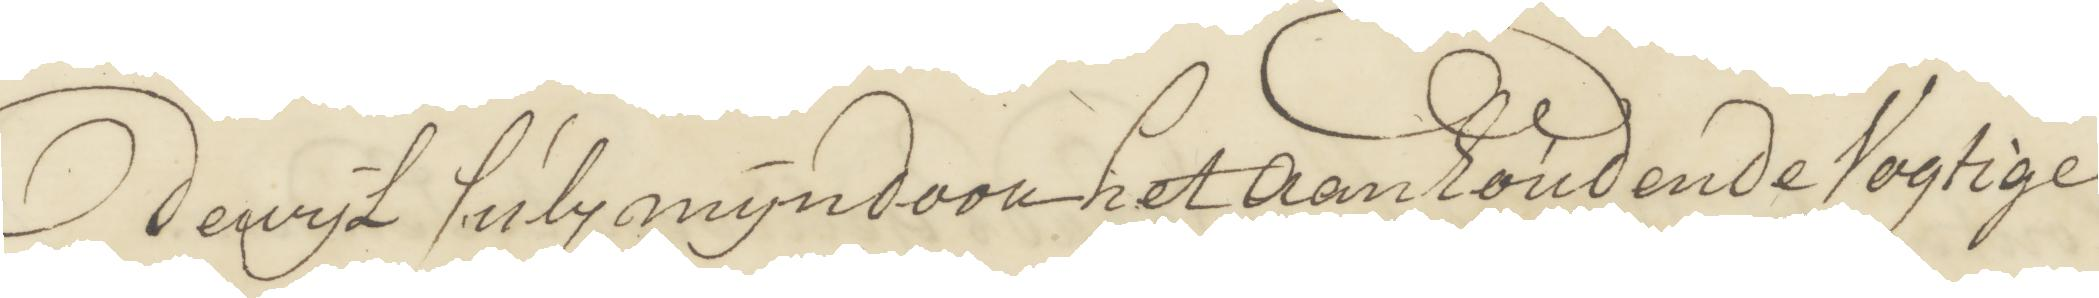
dewijl sulx mijn door het aanhoudende vogtige
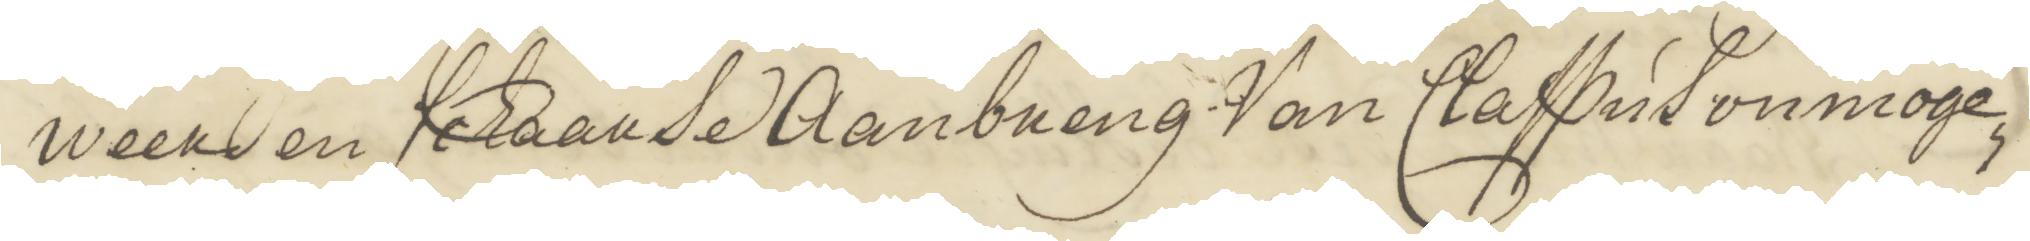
weer en schaarse Aanbreng van Clappus onmoge„
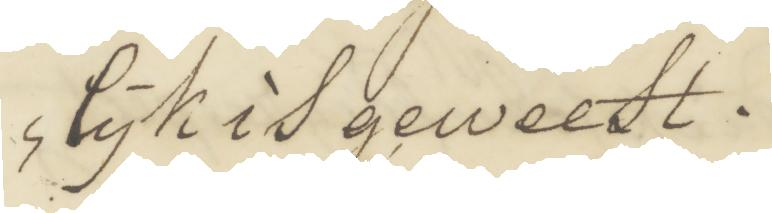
„lijk is geweest.
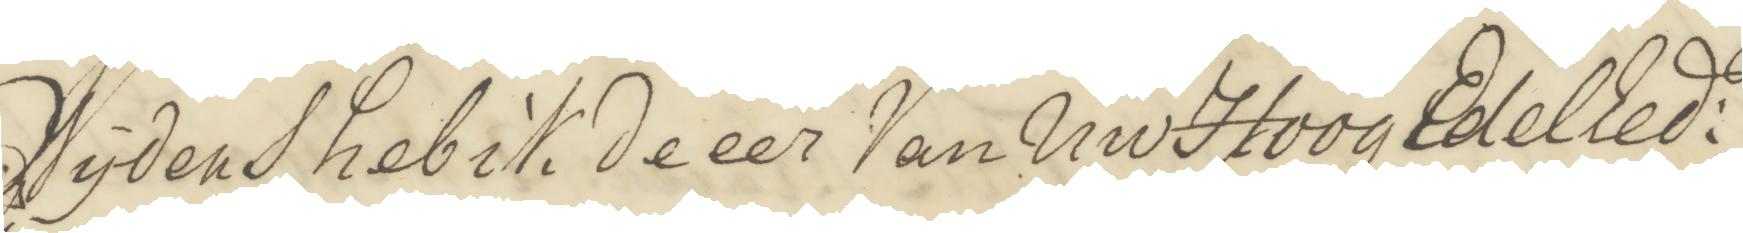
Wijders heb ik de eer van uw Hoog Edelhed:s
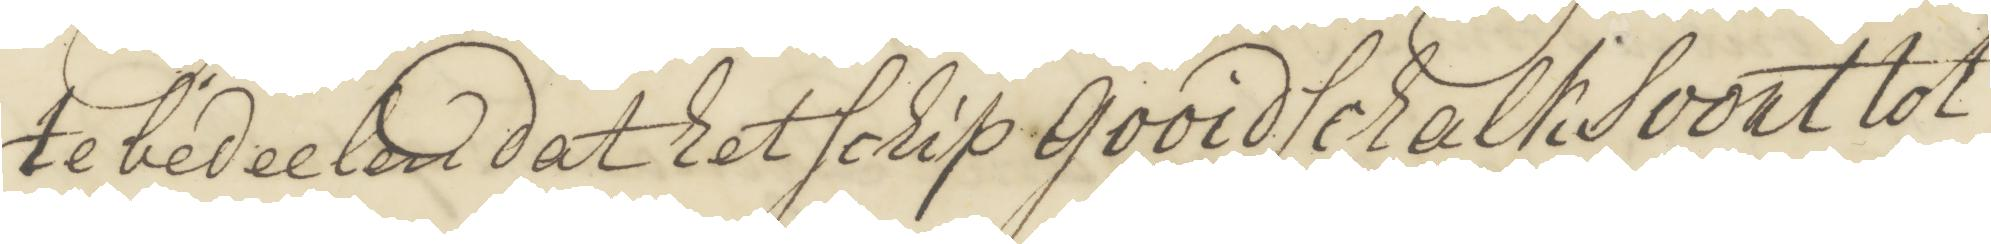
te bedeelen dat het schip gooidschalksoort tot
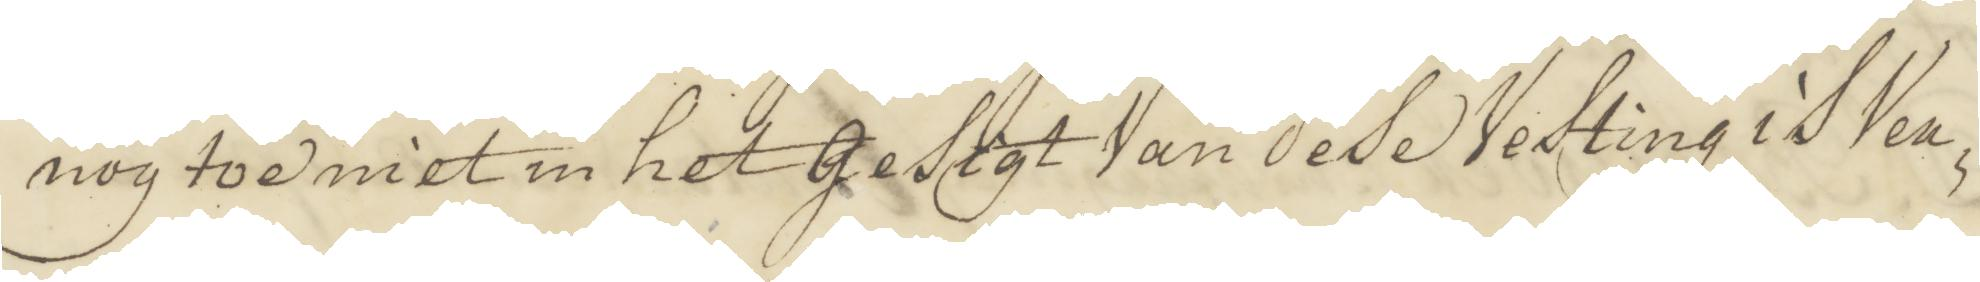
nog toe niet in het gesigt van dese vesting is ver
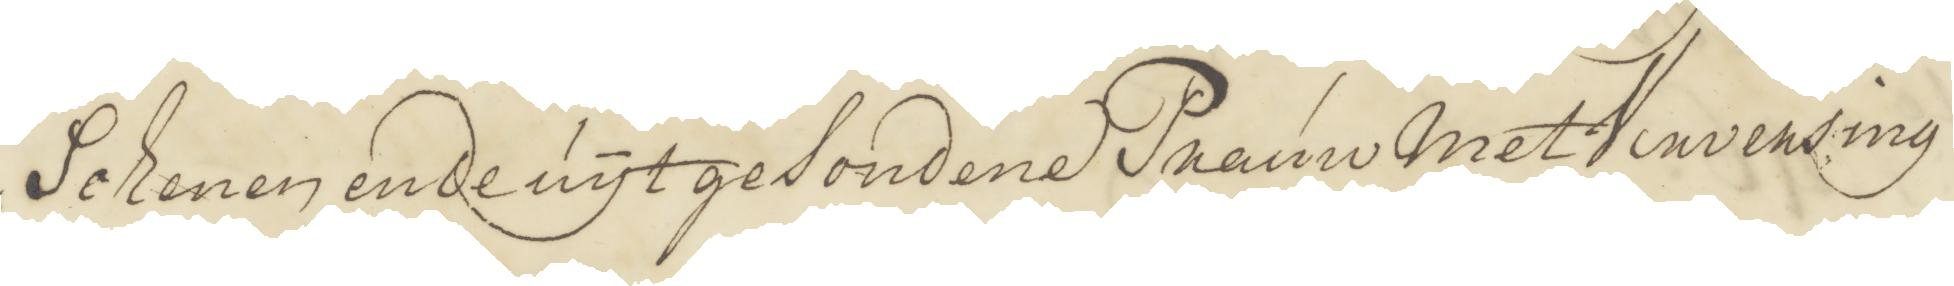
schenen ende uijt gesondene Prauw met verversing
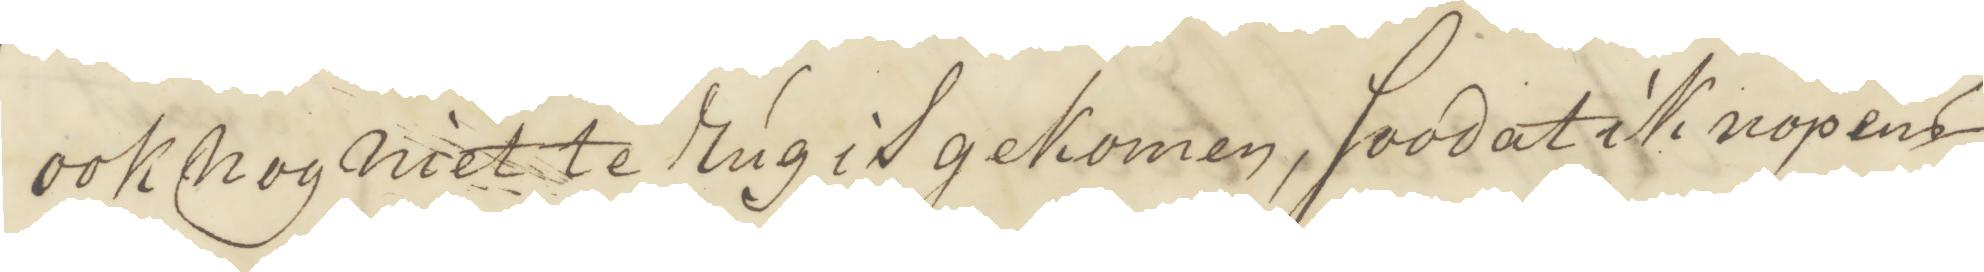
ook nog niet te rug is gekomen, soodat ik nopens
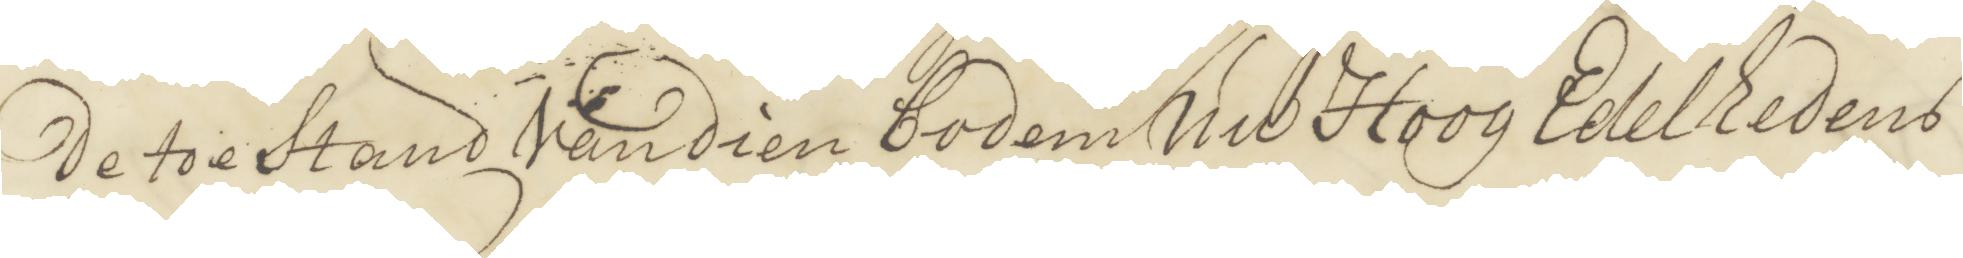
de toe stand van dien bodem uw Hoog Edelhedens
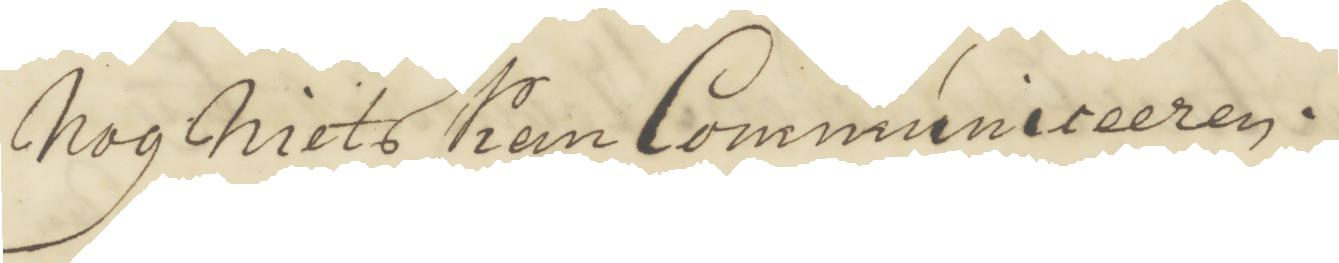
nog niets kan communiceeren.
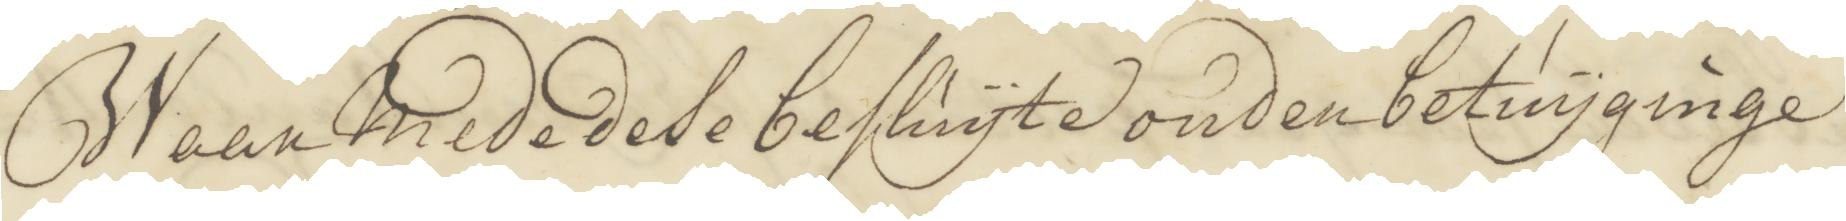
Waar mede dese besluijte onder betuijginge
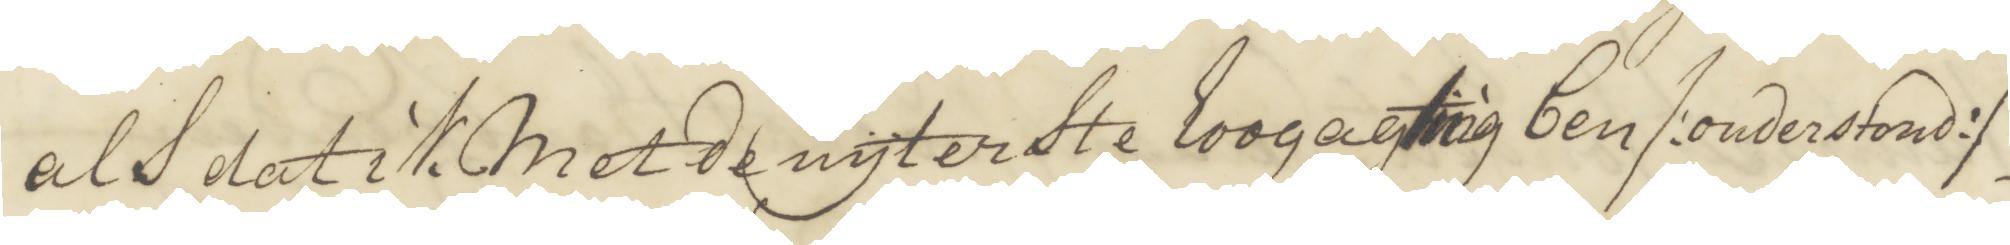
als dat ik met de uijterste hoogagting ben /:onderstond:/
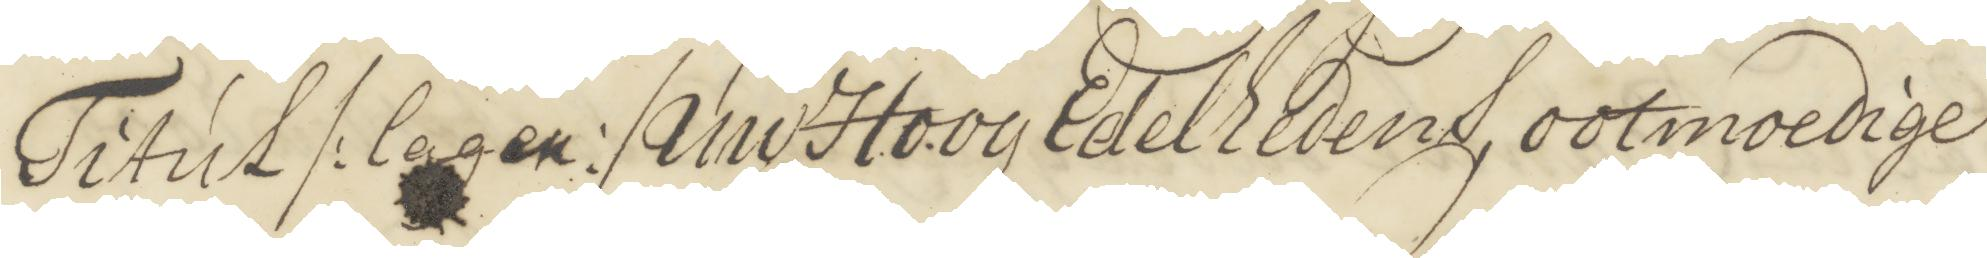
Titul /:lager:/ uw Hoog Edelhedens, ootmoedige
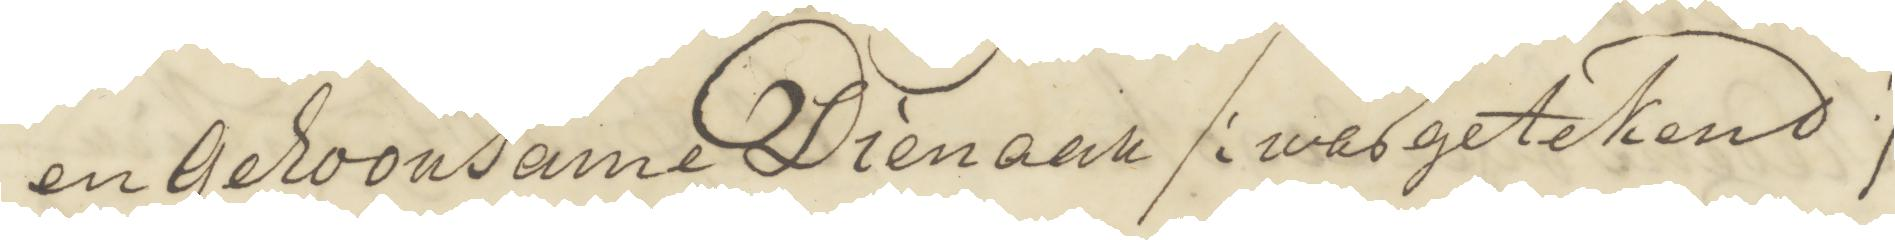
en gehoorsame Dienaar /:was getekend
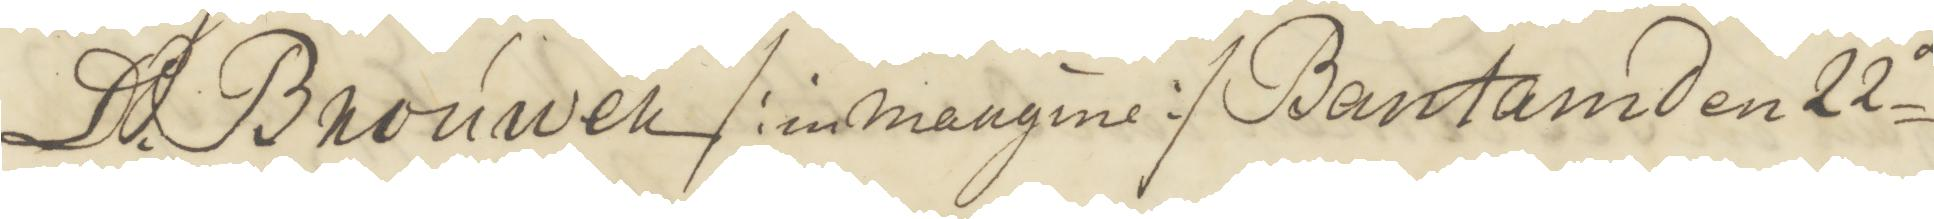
D.o Brouwer /:in margine:/ Bantam den 22=sten
